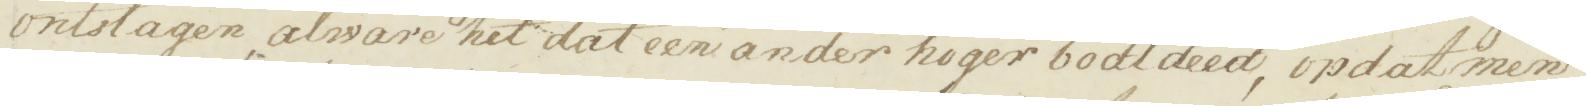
ontslagen, alware het dat een ander hoger bodt deed, opdat men
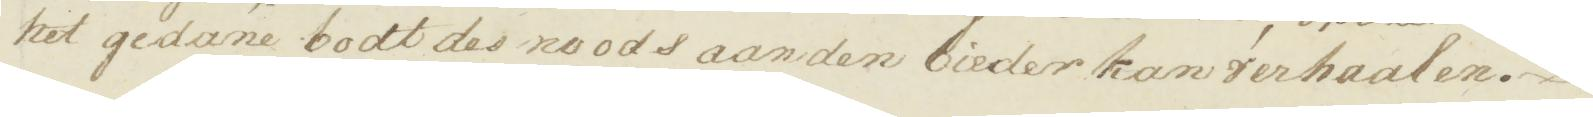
het gedane bodt des noods aan den bieder kan verhaalen.
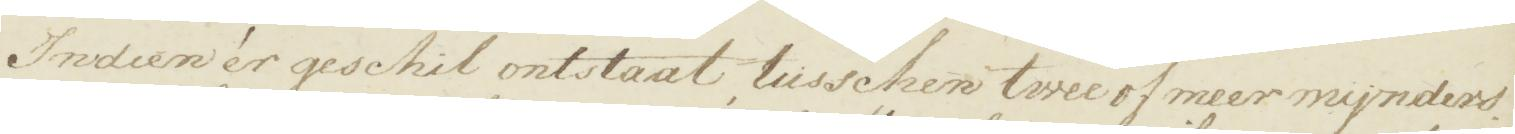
Indien er geschil ontstaat tusschen twee of meer mijnders.
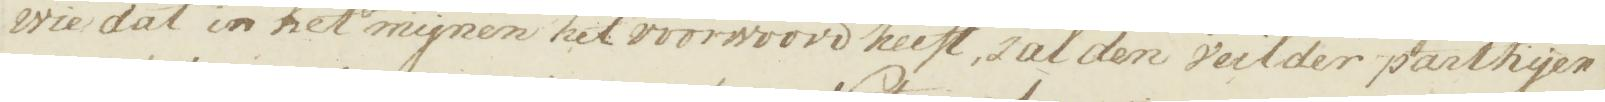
wie dat in het mijnen het voorwoord heeft, zal den veilder parthijen
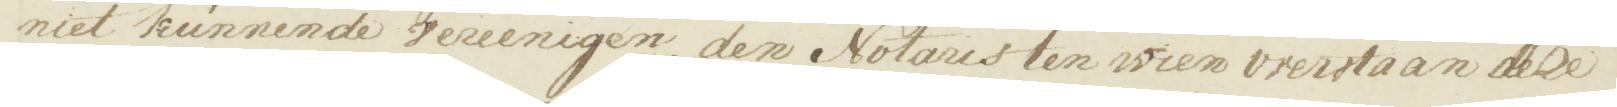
niet kunnende vereenigen, den Notaris ten wien overstaan deze
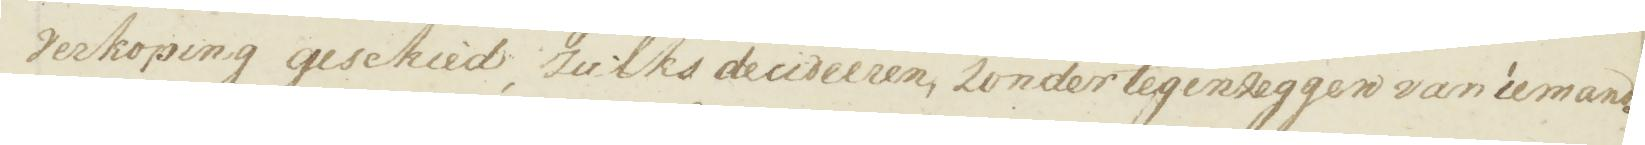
verkoping geschied, zulks decideeren, zonder tegenzeggen van iemand.
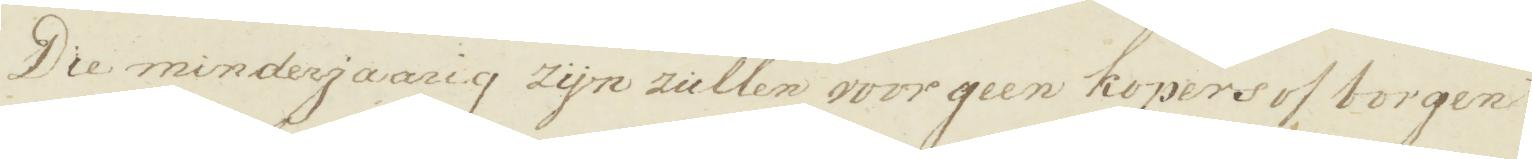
Die minderjaarig zijn zullen voor geen kopers of borgen
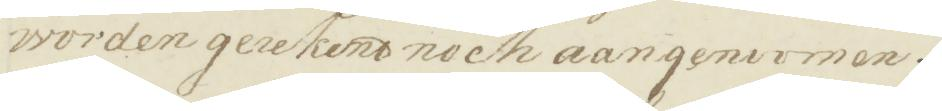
worden gerekend noch aangenoomen.
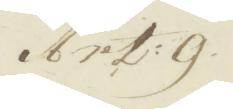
Art: 9.
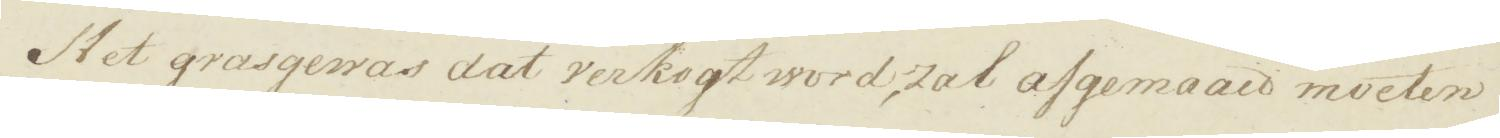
Het grasgewas dat verkogt word, zal afgemaaid moeten
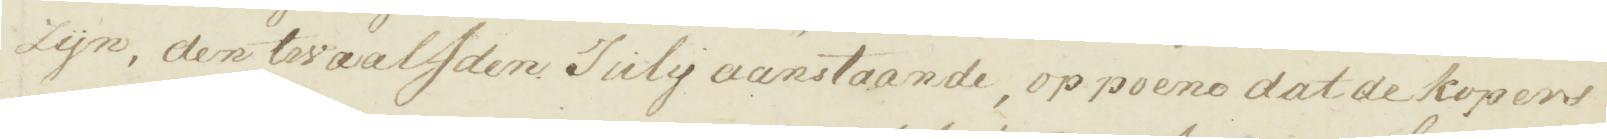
zijn, den twaalfden Iulij aanstaande, op poeno dat de kopers
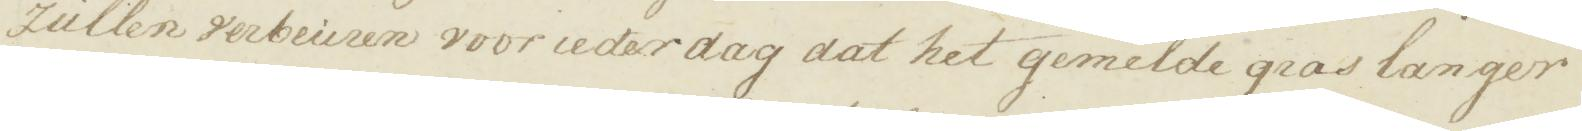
zullen verbeuren voor ieder dag dat het gemelde gras langer
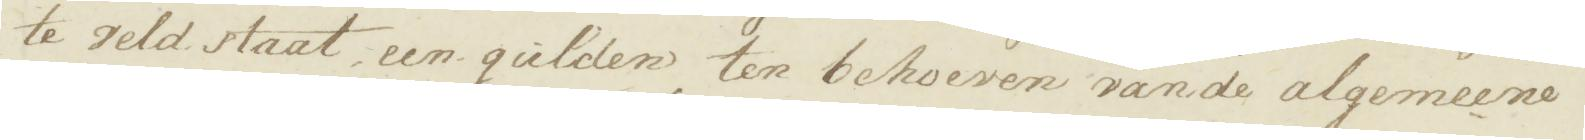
te veld staat, een gulden, ten behoeven van de algemeene
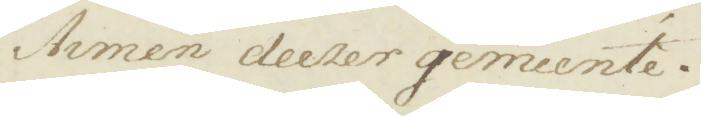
Armen deezer gemeente.
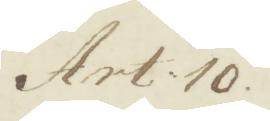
Art: 10.
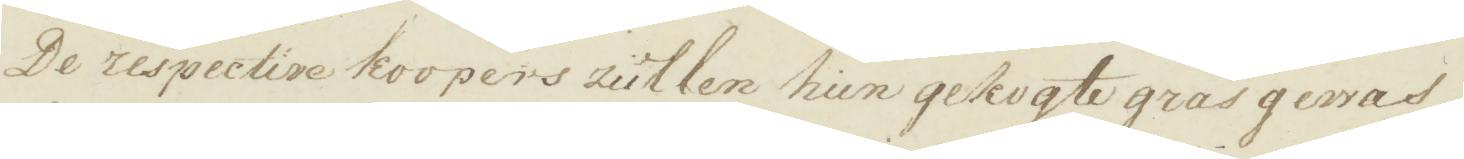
De respective koopers zullen hun gekogte gras gewas
